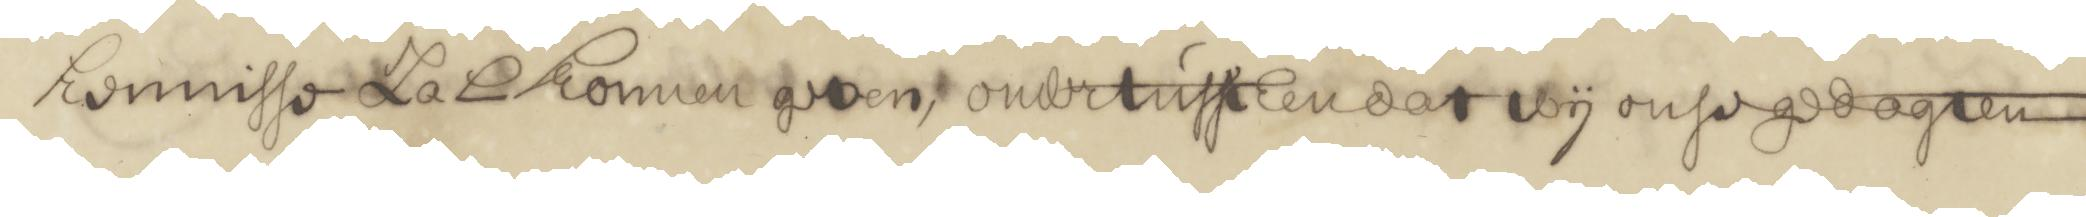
kennisse zal konnen geven, ondertusschen dat wij onse gedagten
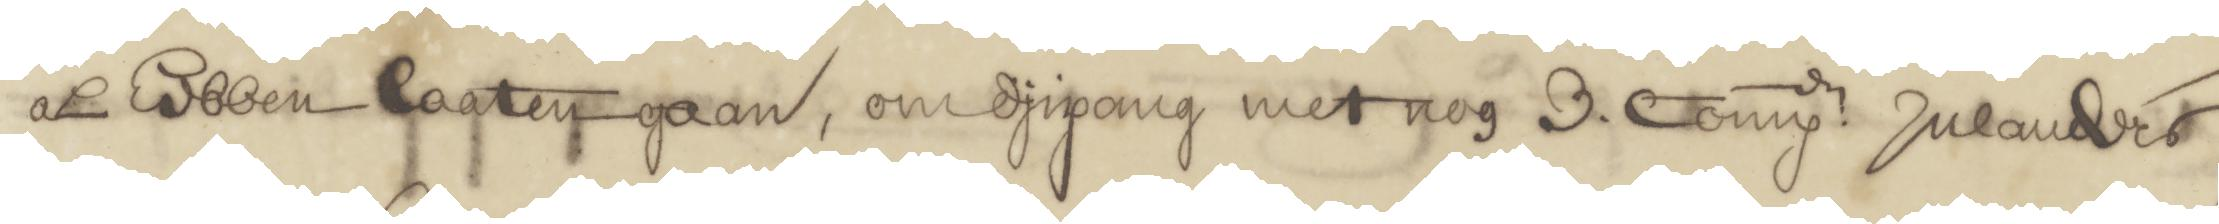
al hebben laaten gaan, om djipang met nog 3. Comp:en Jnlanders
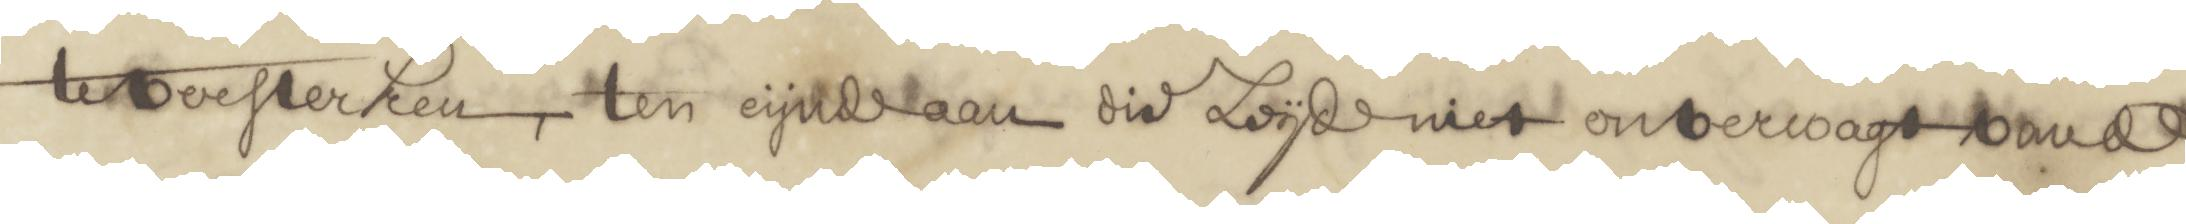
te versterken, ten eijnde aan die zeijde niet onverwagt van d
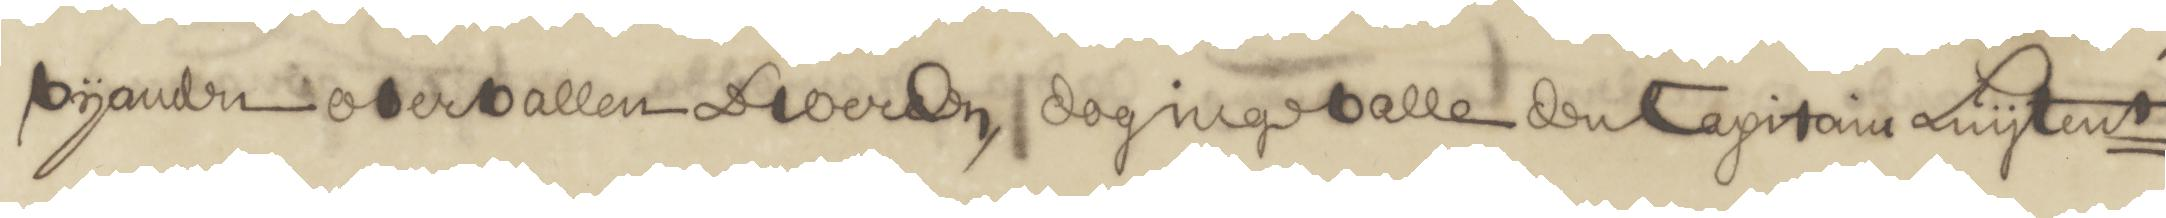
vijanden overvallen te werden, dog in gevalle den Capitain Luijten=t
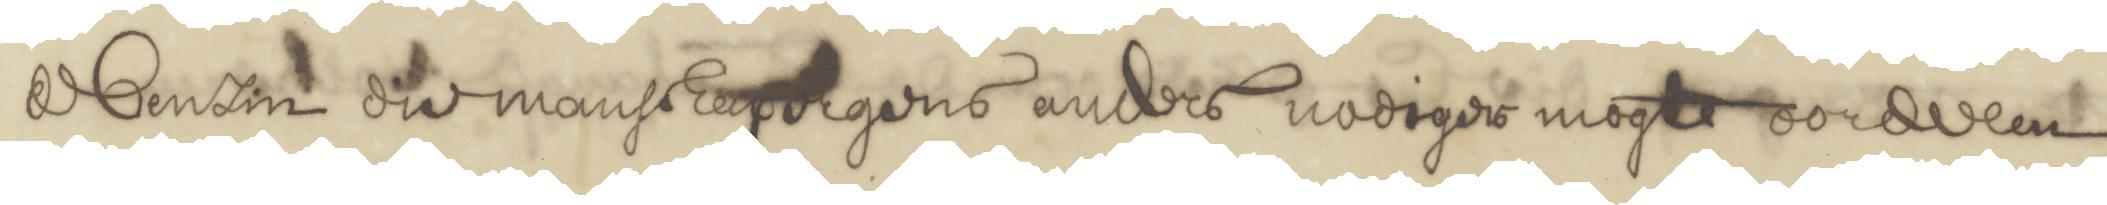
de benzin die manschap ergens anders nodiger mogte oordeelen
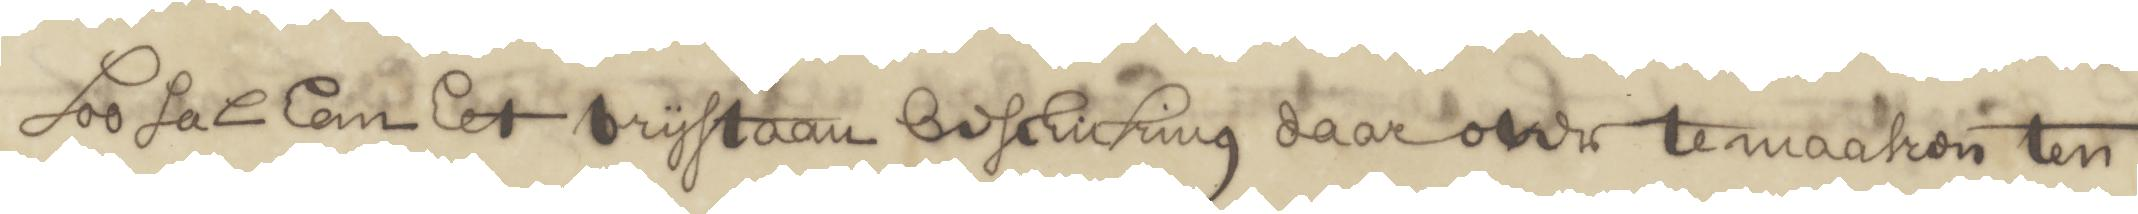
soo sal hem het vrijstaan beschicking daar over te maaken ten
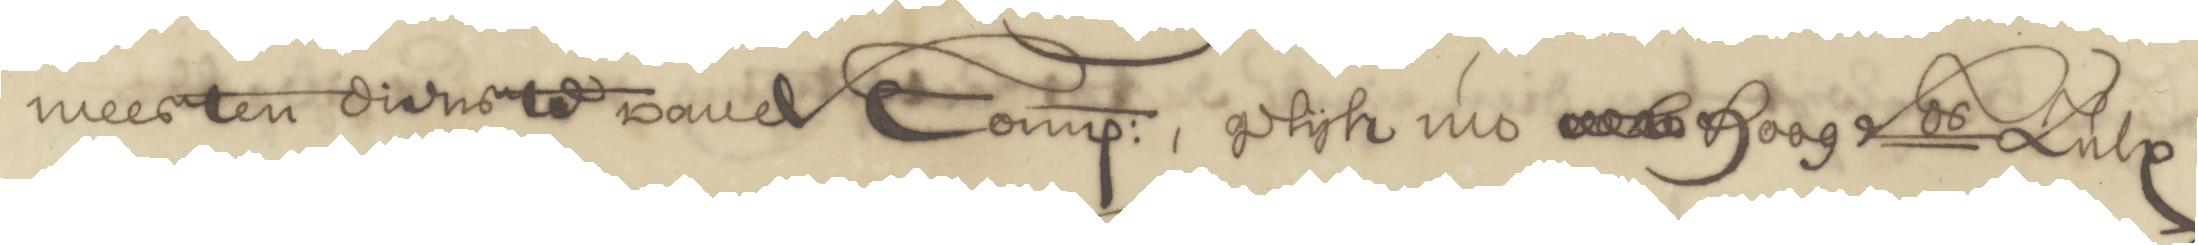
meesten dienste vand Comp:, gelijk uw ook Hoog E=ds zulx
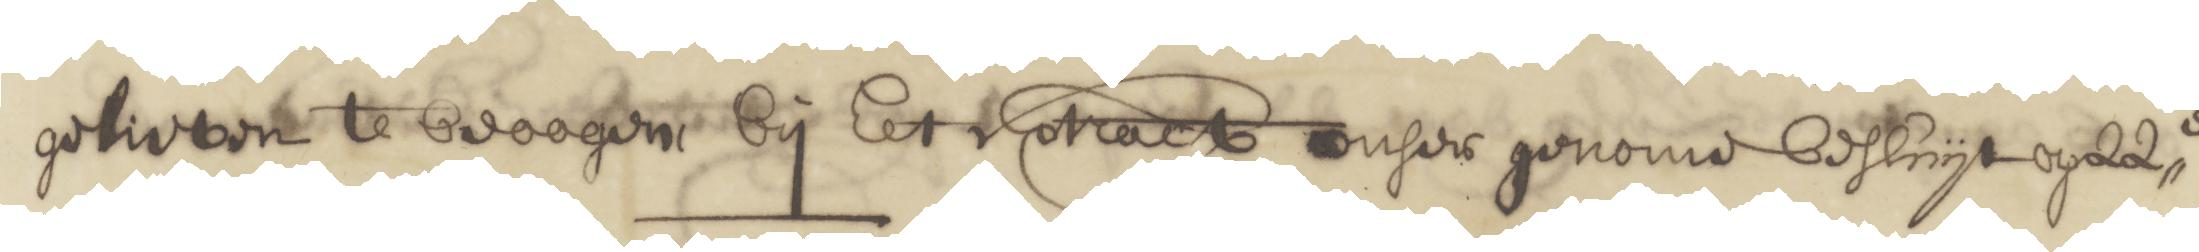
gelieven te beoogen bij het Extract onser genome besluijt op 22„
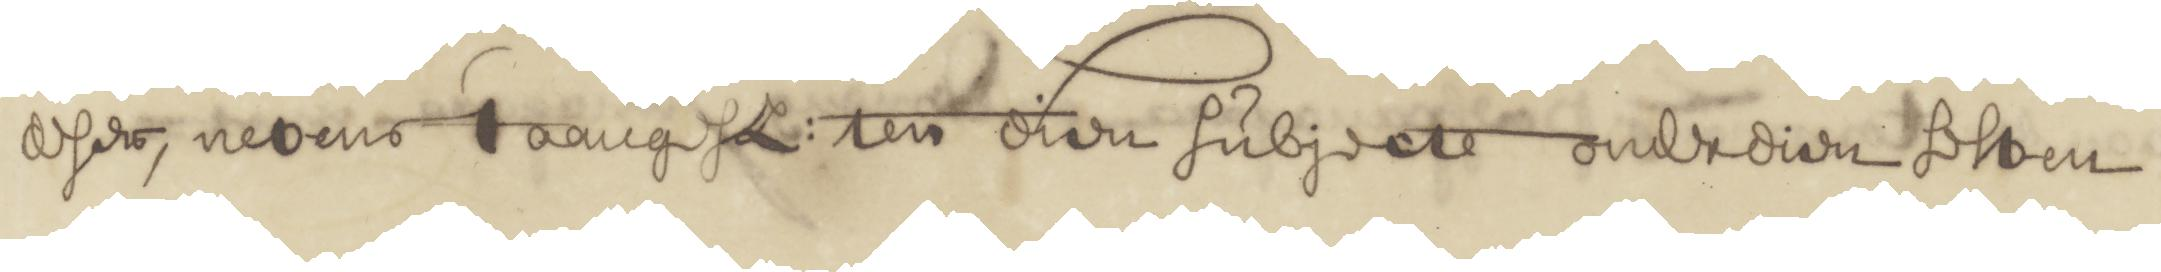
deser, nevens 't aangesz: ten dien subjecte onder dien selven
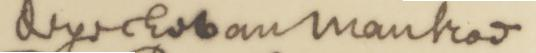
depeche van mankoe
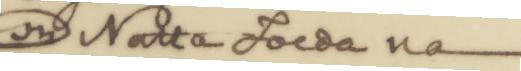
en Natta soeda na
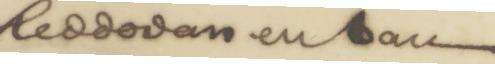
heddoean en van
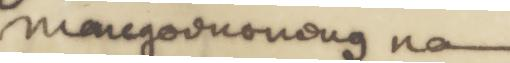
mangoenoneng na
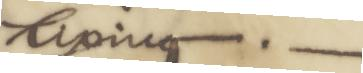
kiping — . —
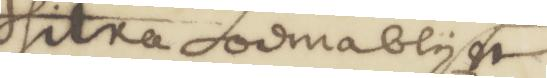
Tsitra Soema blijft
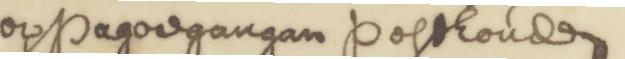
op Pagoegangan posthouden
